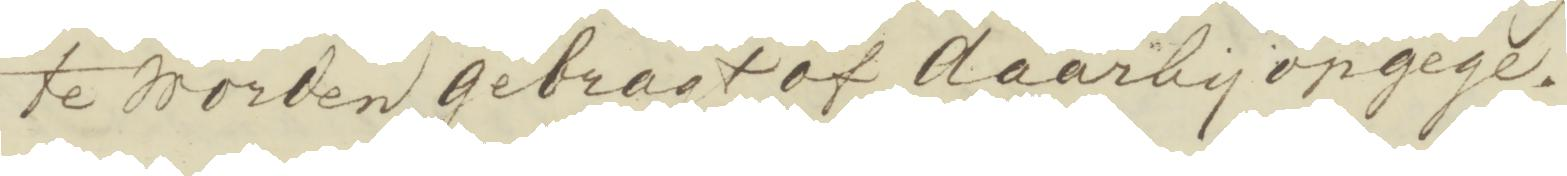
te worden gebragt of daarbij opgege„
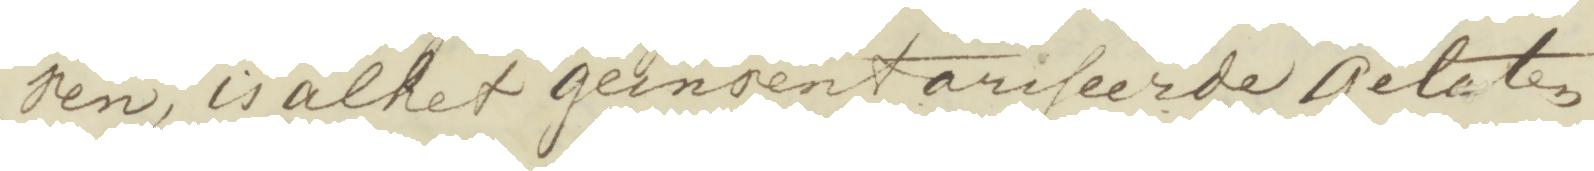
ven, is alhet geinventariseerde gelaten
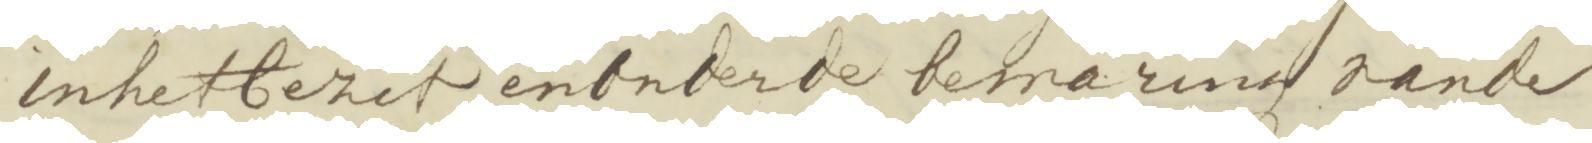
in het bezit en onder de bewaring vande
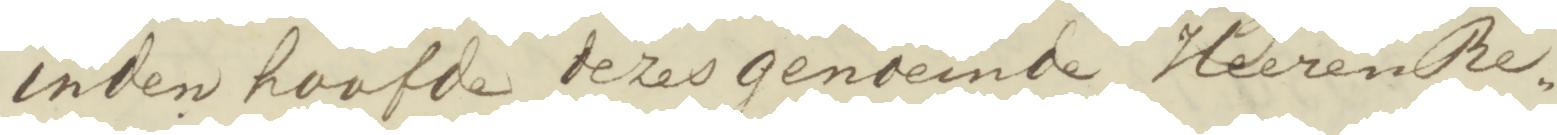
in den hoofde dezes genoemde Heeren Re„
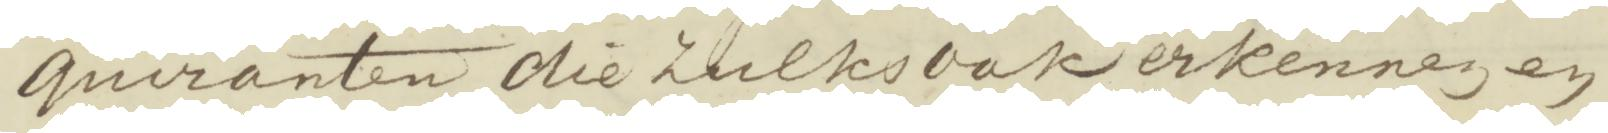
quiranten die zulks ook erkennen en
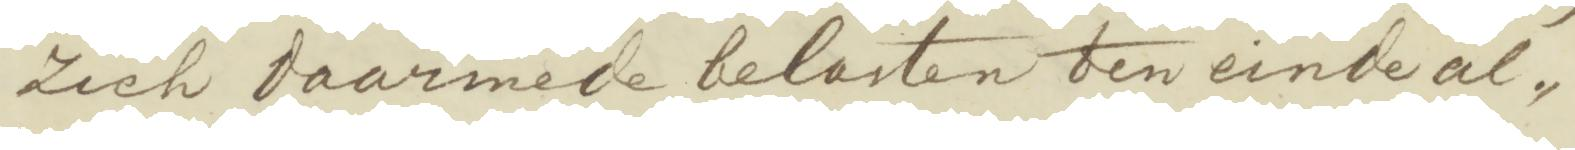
zich daarmede belasten ten einde al„
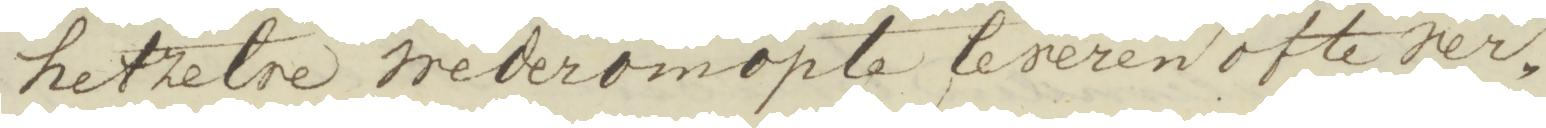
hetzelve wederom op te leveren of te ver„
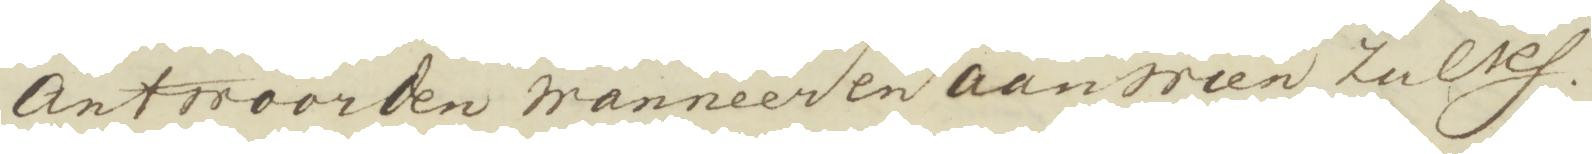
antwoorden wanneer en aan wien zulks.
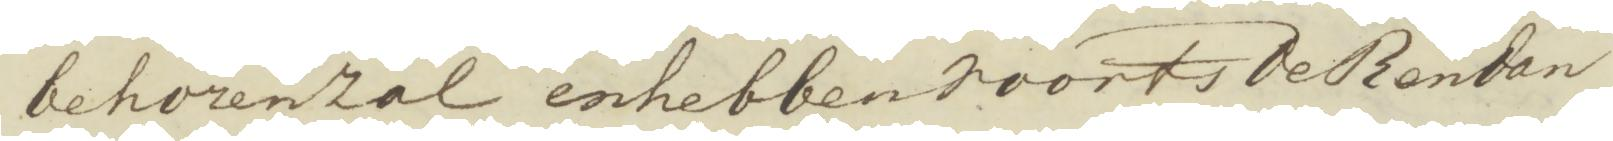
behoren zal en hebben voorts de Rendan
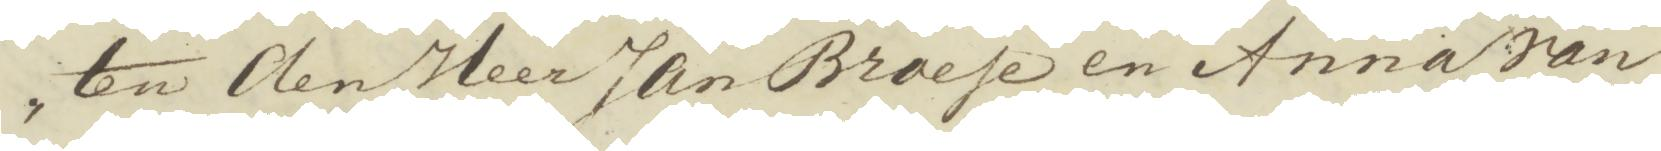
„ten den Heer Jan Broese en Anna van
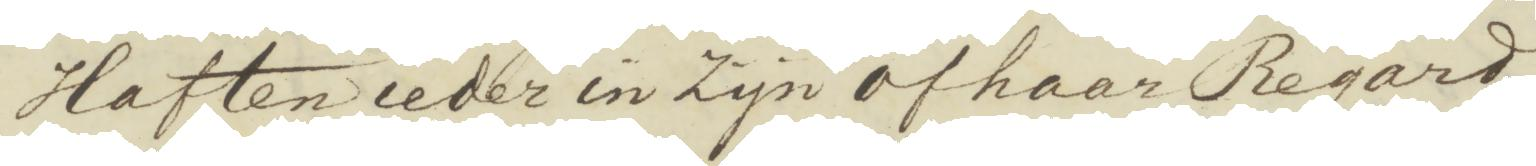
Haften ieder in zijn of haar Regard
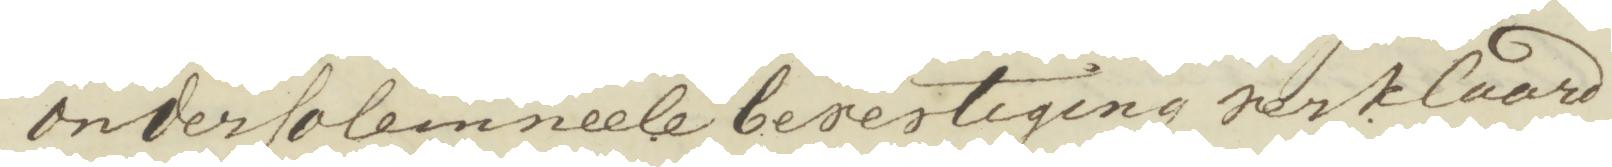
onder solemneele bevestiging verklaard
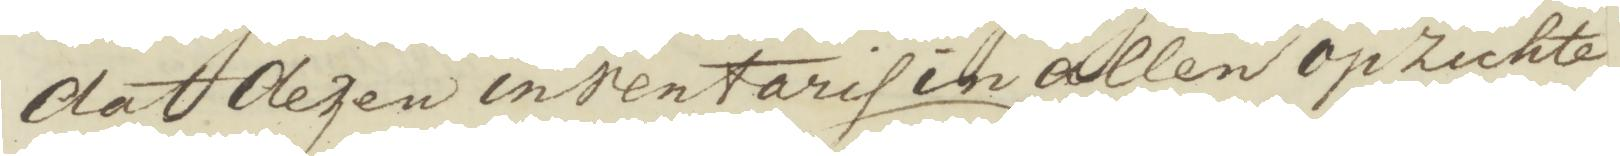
dat dezen inventaris in allen op zichte
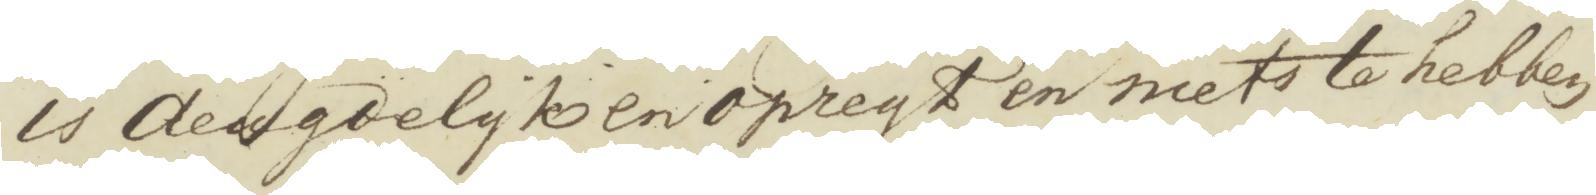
is deugdelijk en opregt en niets te hebben
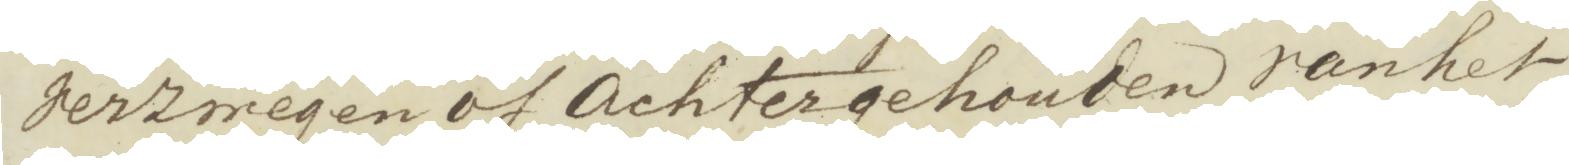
verzwegen of achtergehouden van het
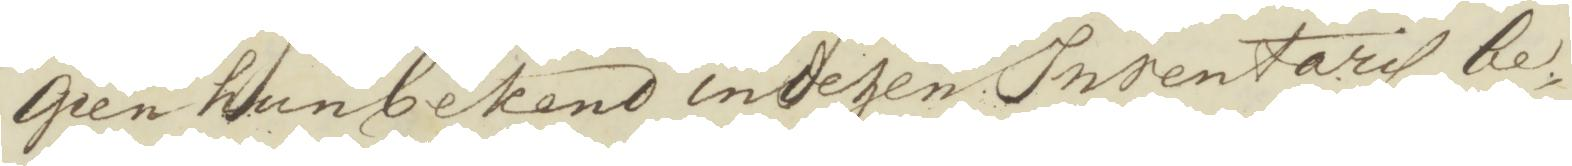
geen hun bekend in dezen Inventaris be„
